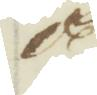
d:e
